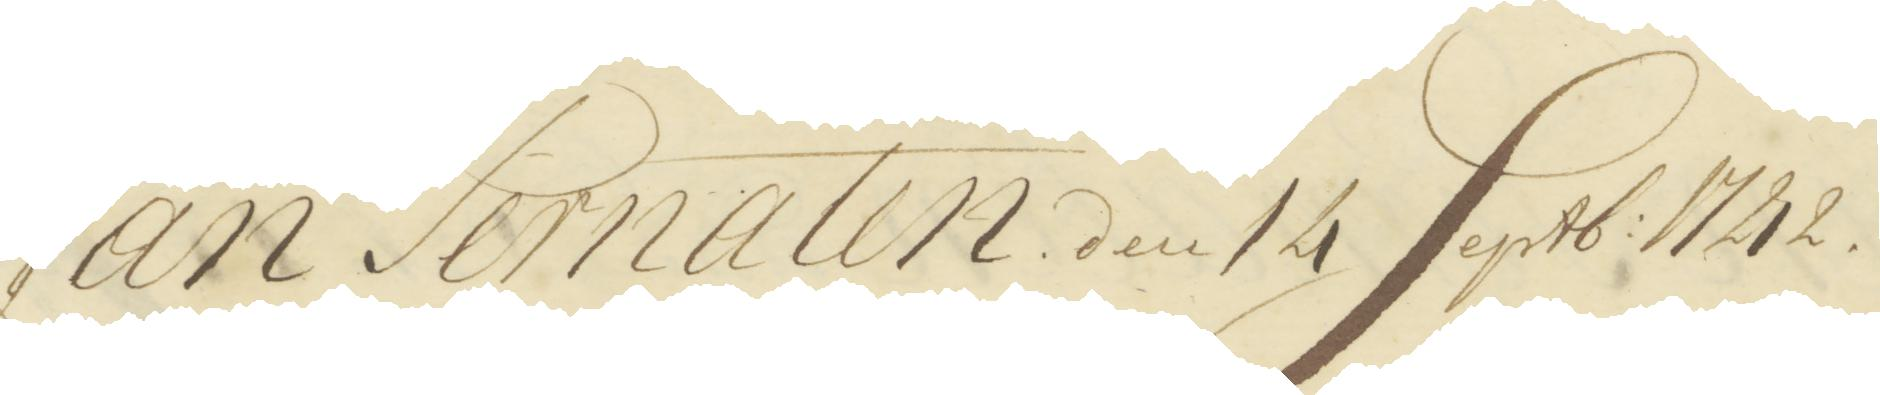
Van Ternaten den 14 Septb: 1742.
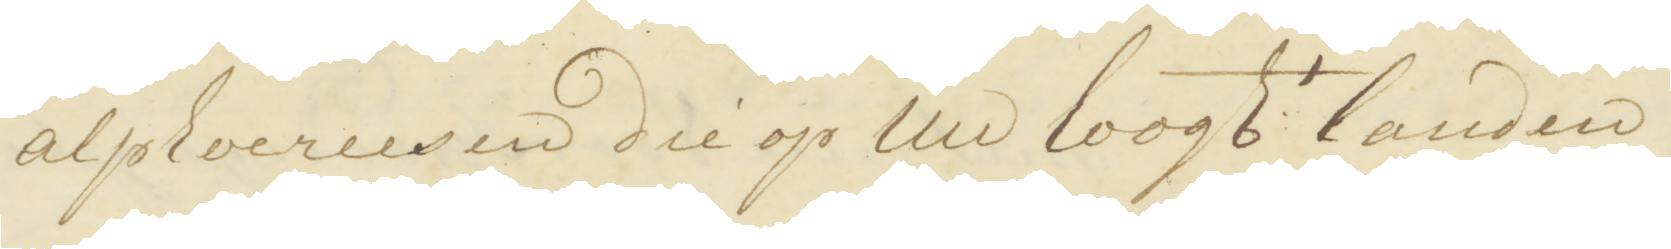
alphoereesen die op uw hoogh:t landen
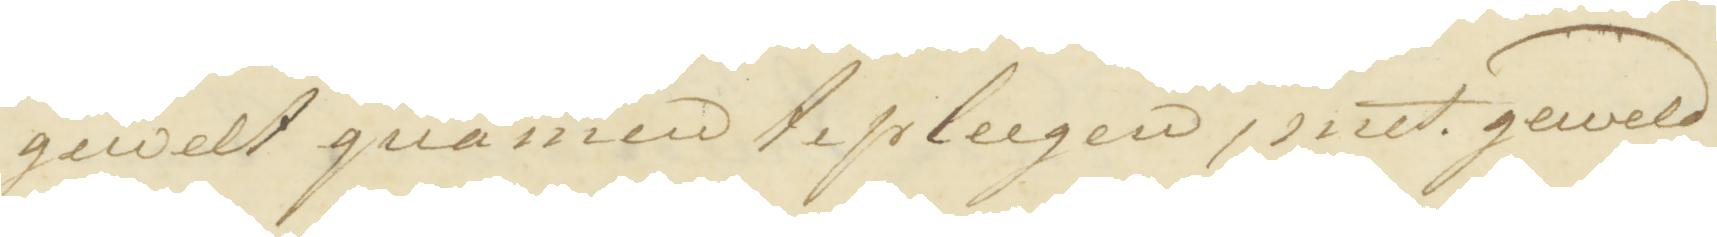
gewelt quamen te pleegen, met geweld
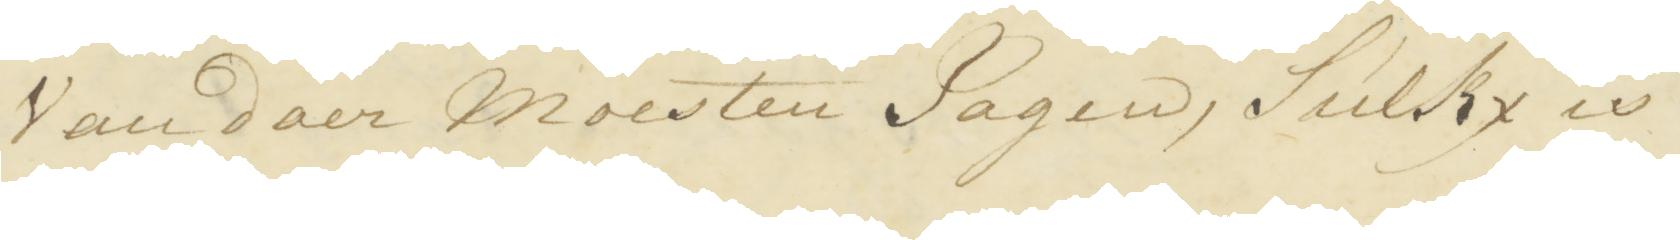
van daer moesten Iagen, sulkx is
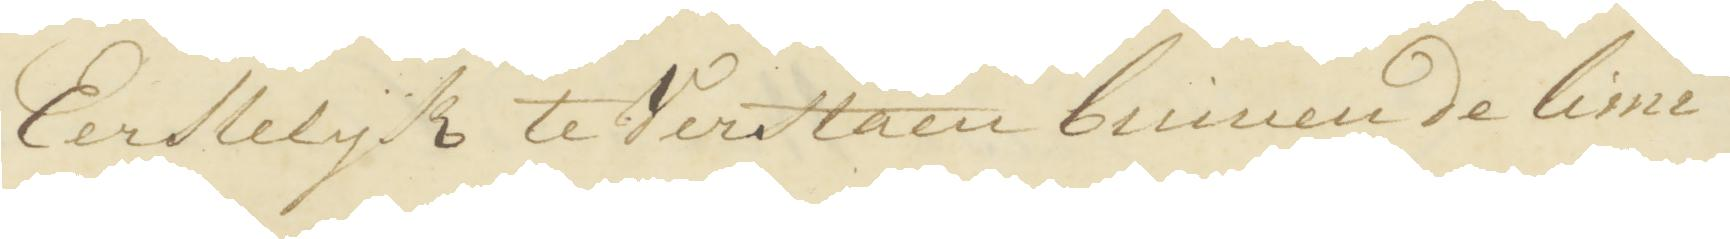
Eerstelijk te Verstaen binnen de limi
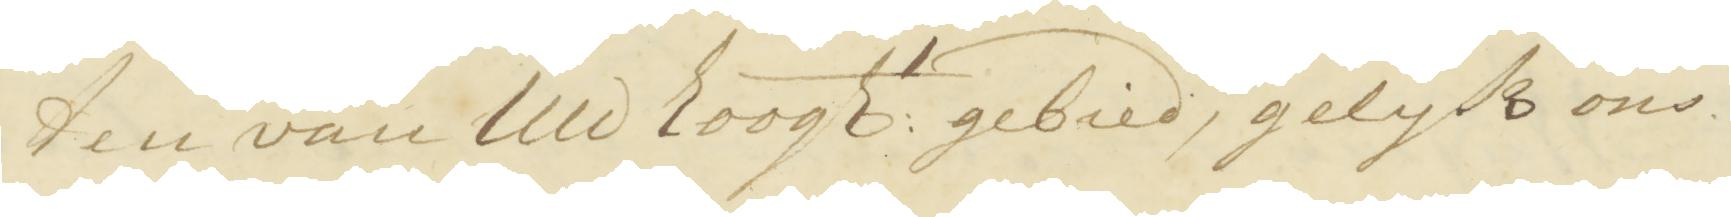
ten van Uw hoogh:t gebied, gelijk ons
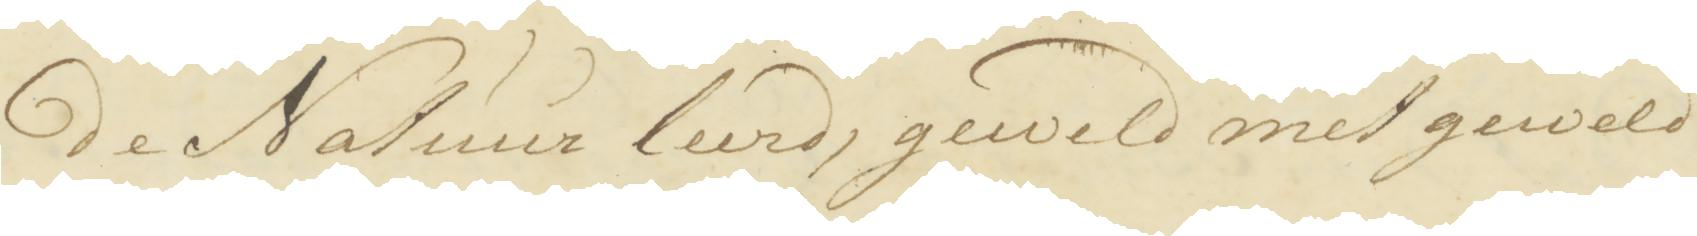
de Natuur leerd, geweld met geweld
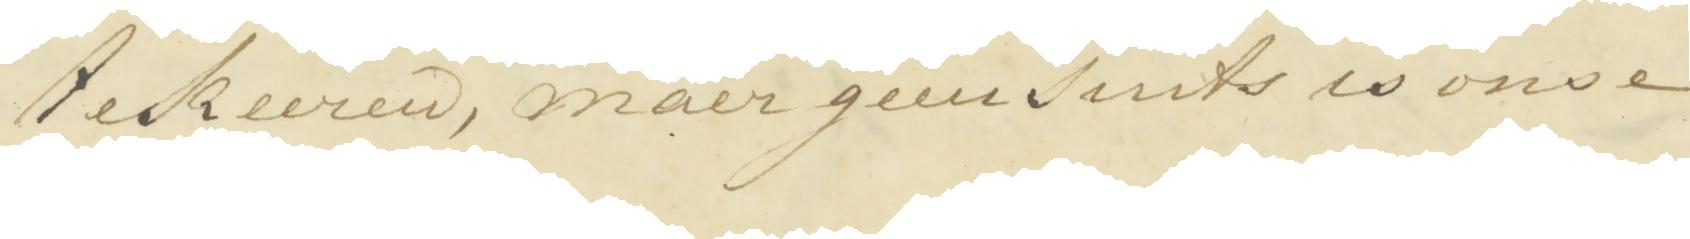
tekeeren, maer geensints is onse
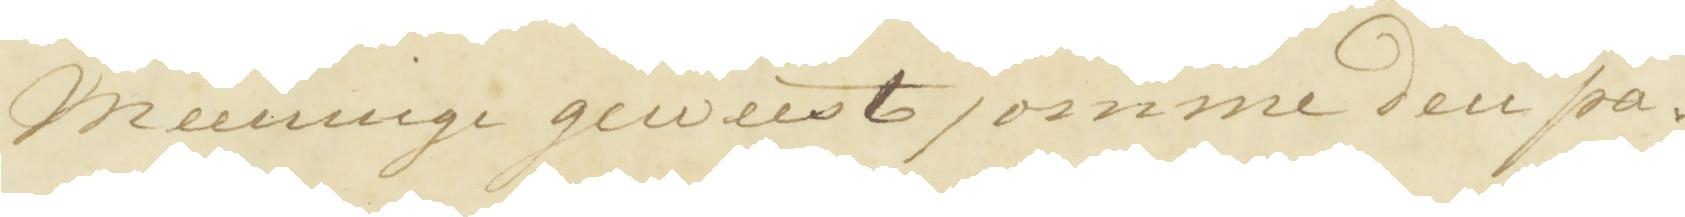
meeninge geweest, omme den pa
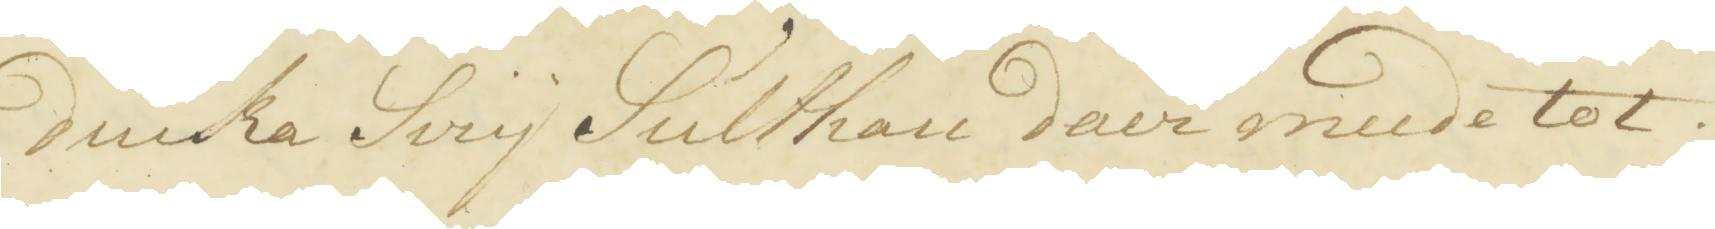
ducka sirij sulthan daer meede tot
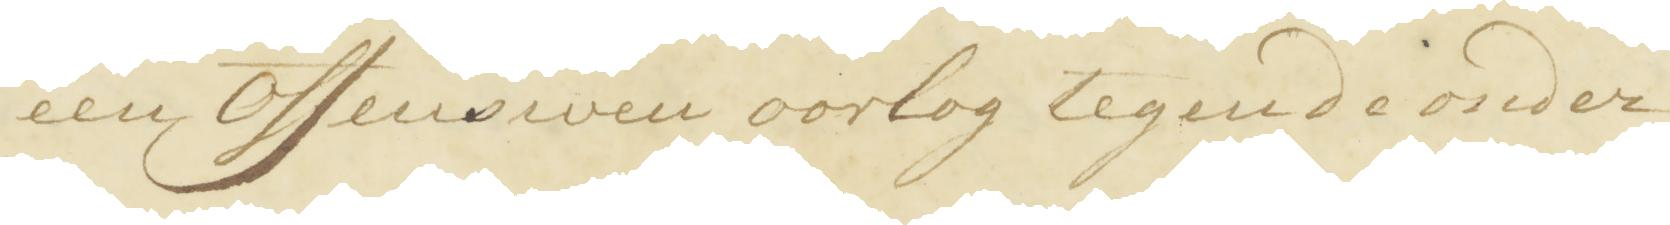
een Offensiven oorlog tegen de onder
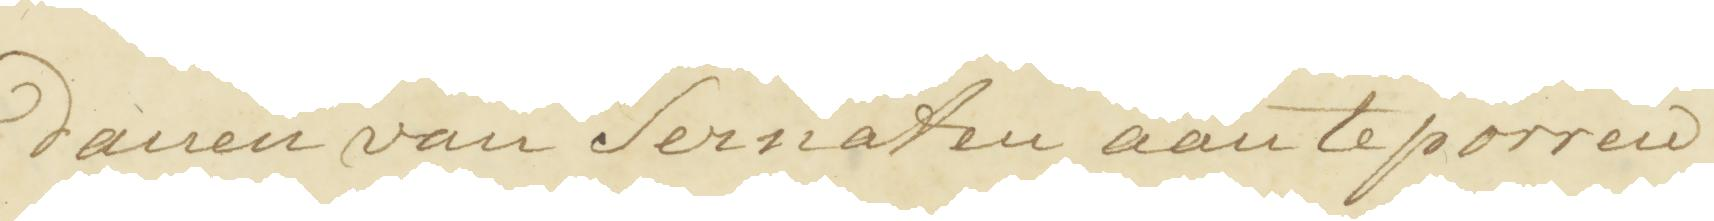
danen van Ternaten aan te porren
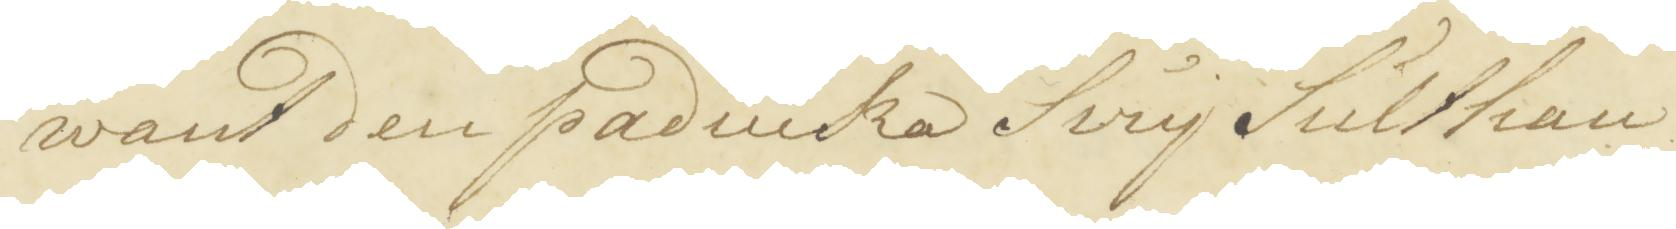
want den paducka sirij sulthan
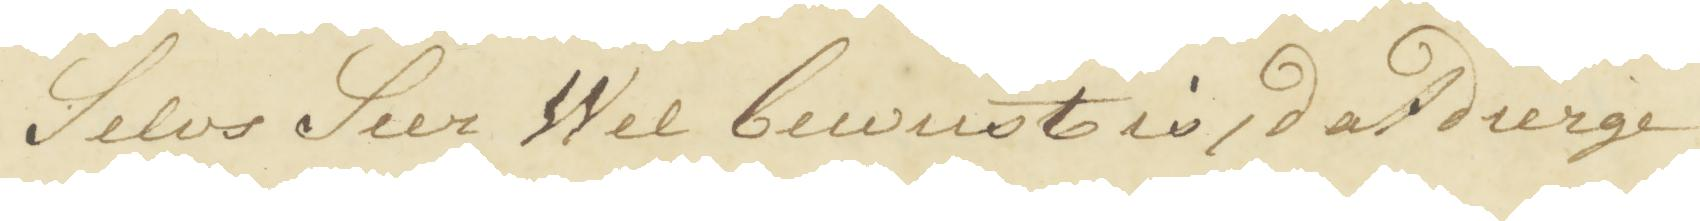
selvs seer Wel bewust is, dat dierge
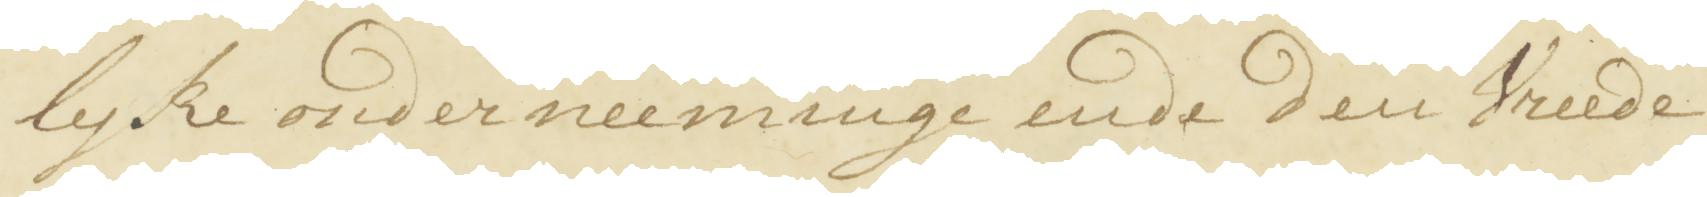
lyke onderneeminge ende den Vreede
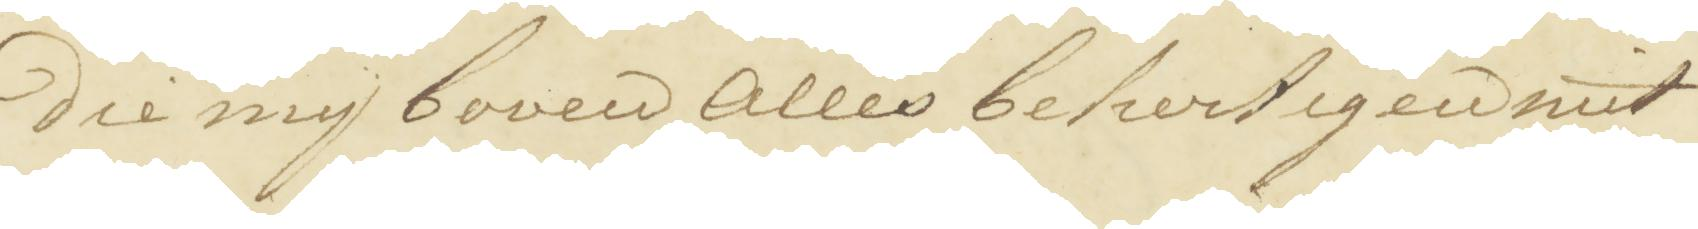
die mij boven alles behertigen nut
